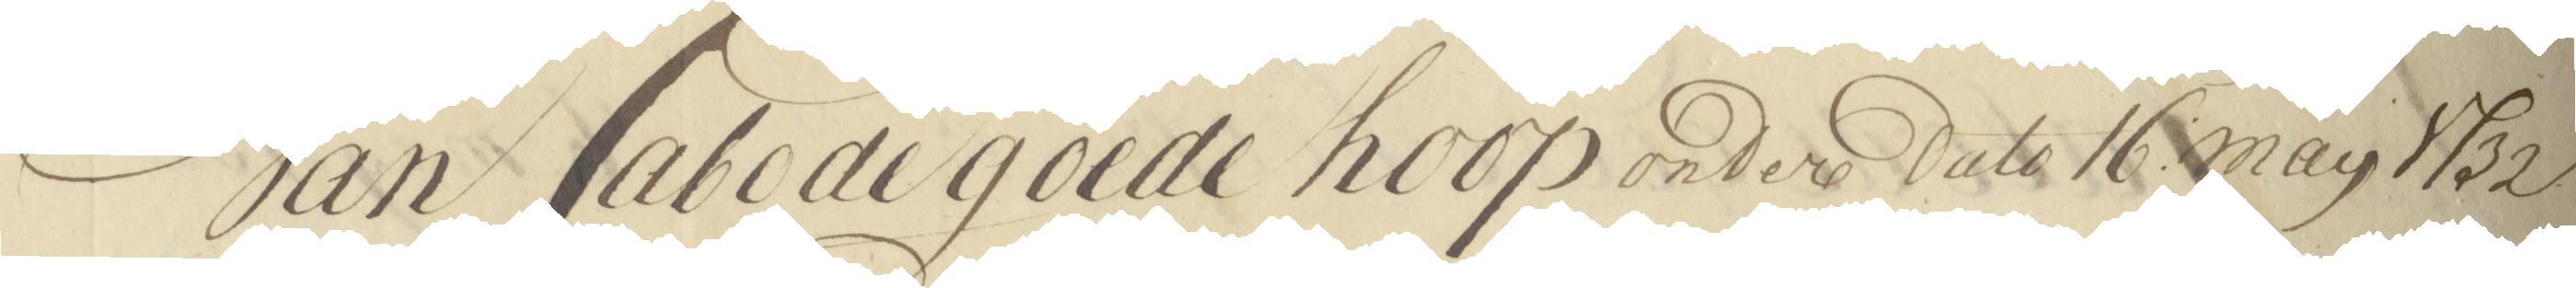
Van Cabo de goede hoop onder dato 16:' maij 1732
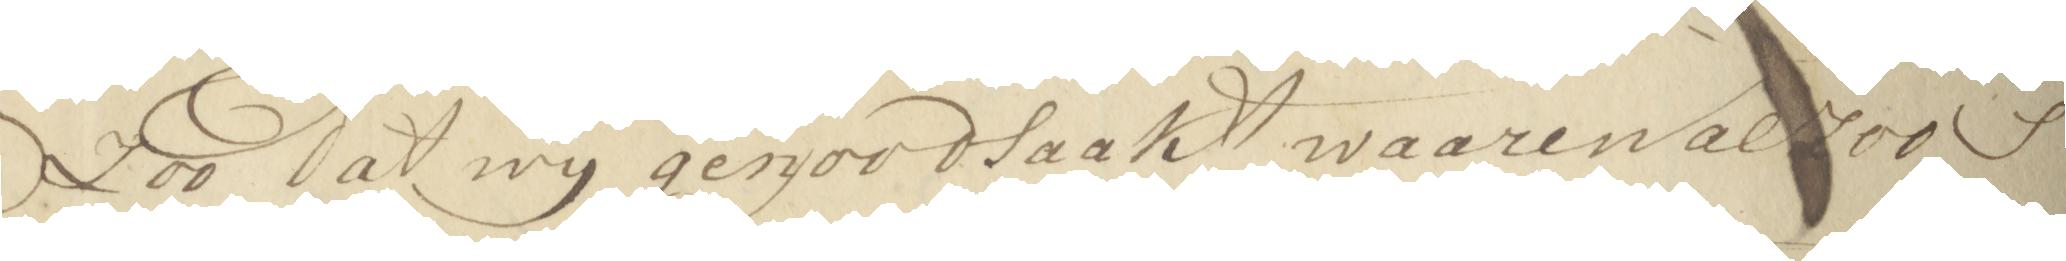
zoo dat wij genoodsaakt waaren alzoo 's
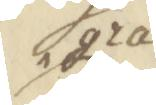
^ gra
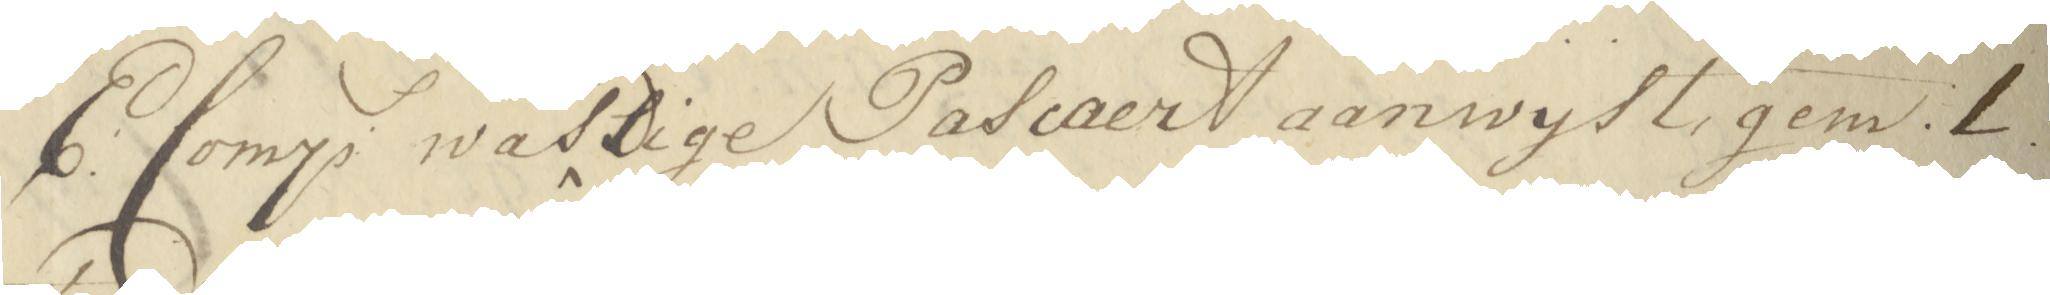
E: Comp:s was ^ dige Pascaert aanwijst, gem: /
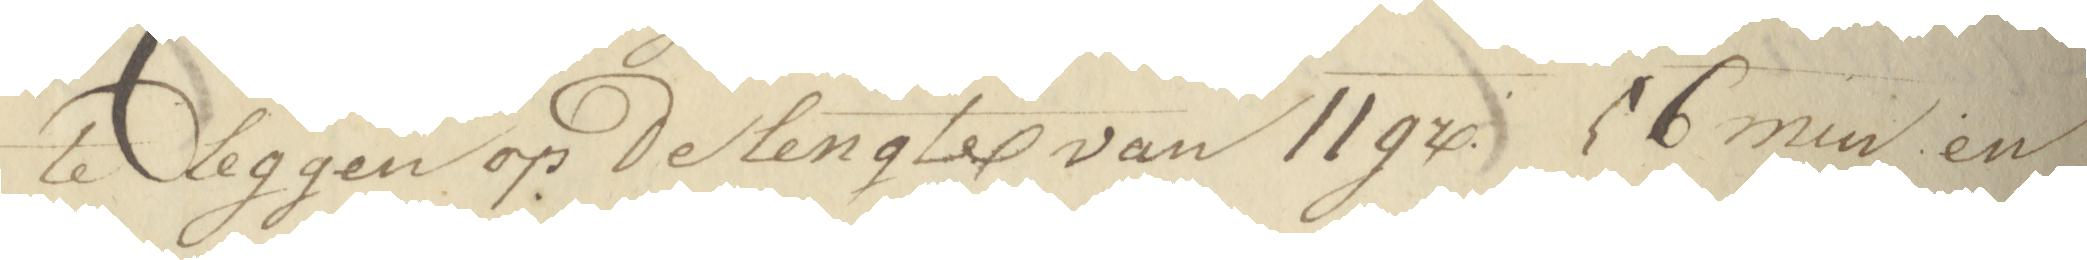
te leggen op de lengte van 11 gr: 56 min: en
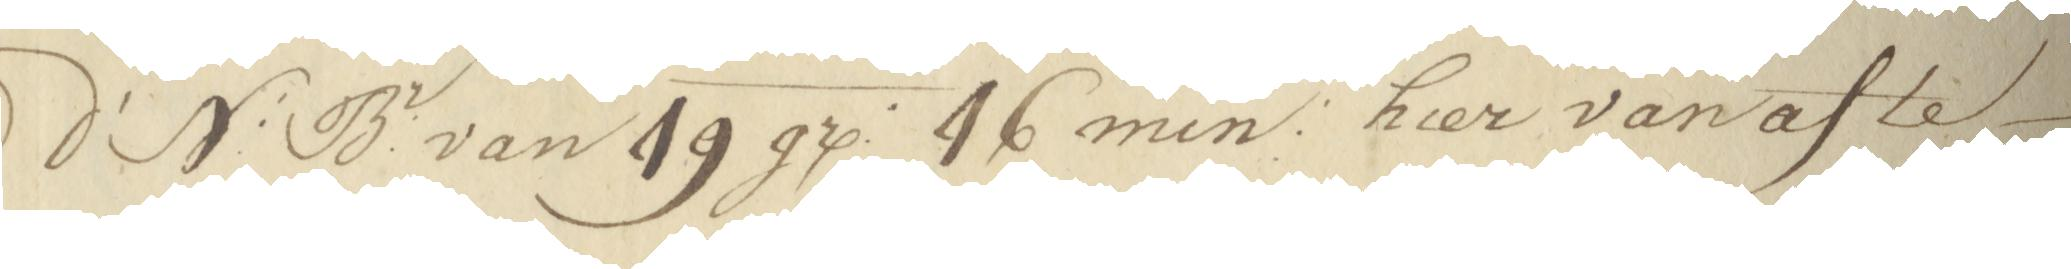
d’ N: B:r van 49 gr: 46 min: hier van afte —
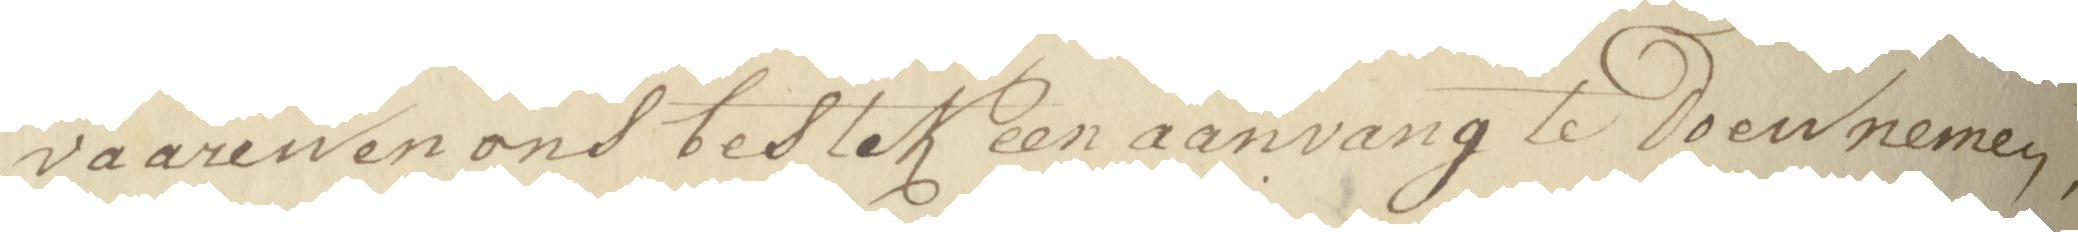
vaaren en ons bestek een aanvang te doen nemen
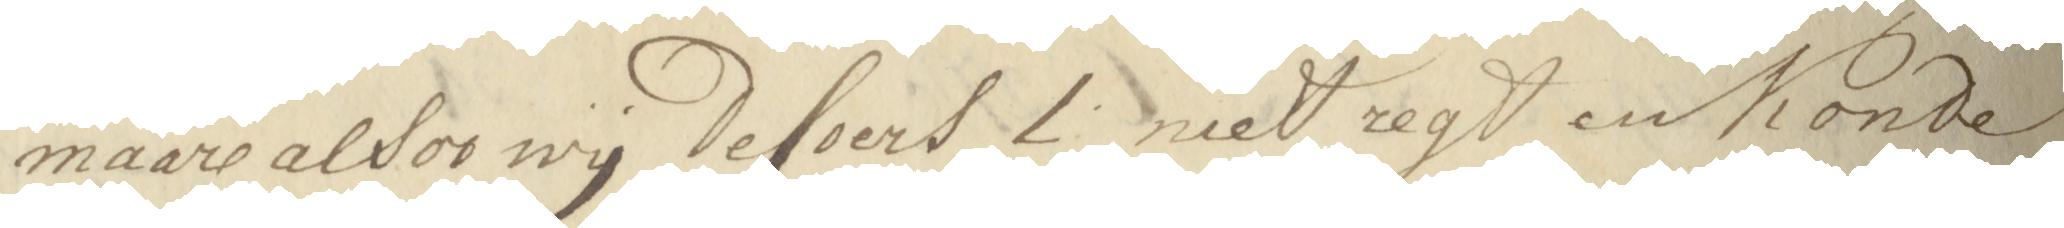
maar alsoo wij de coers / niet regt en konde
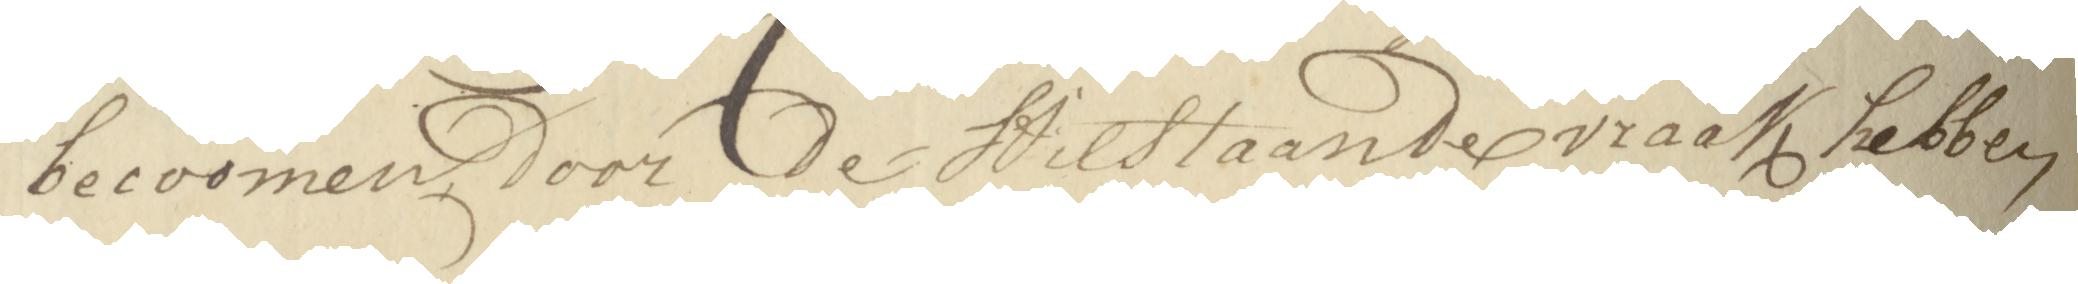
becoomen, door de stilstaande vraak hebben
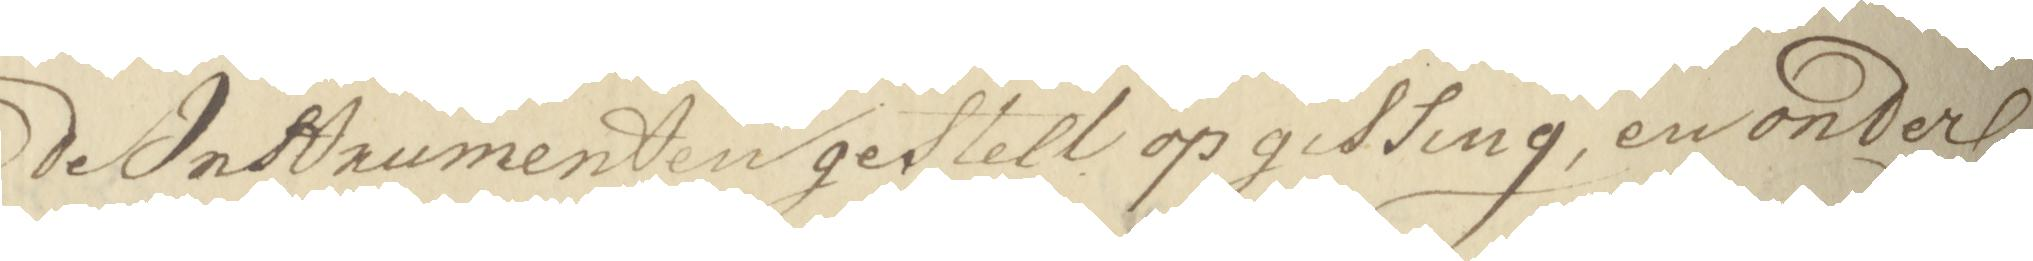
de Instrumenten gestelt op gissing, en onder
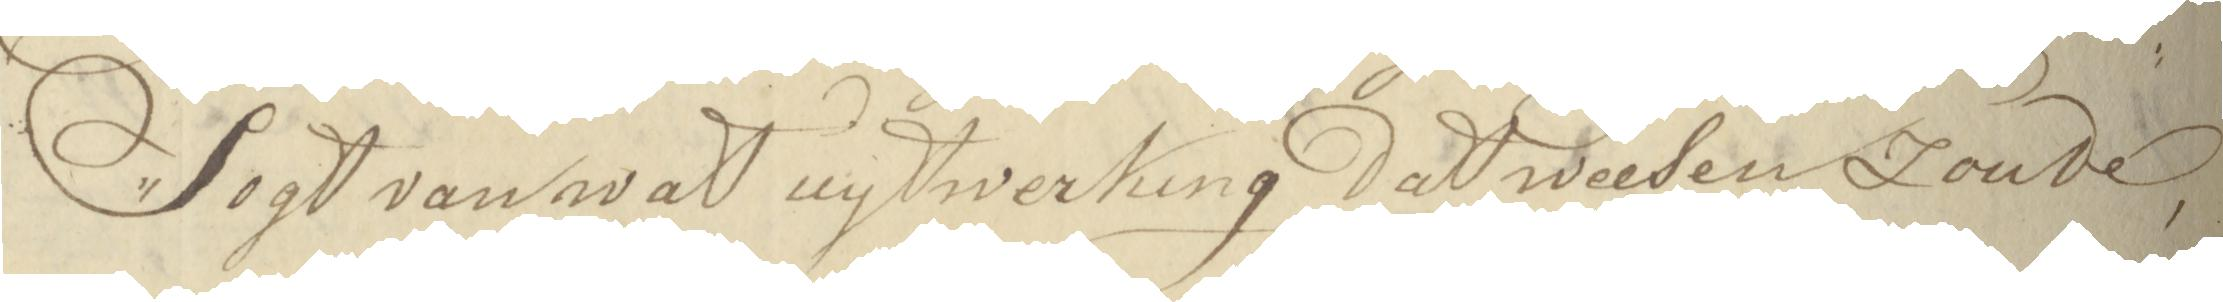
„sogt van wat uijtwerking dat weesen zoude,
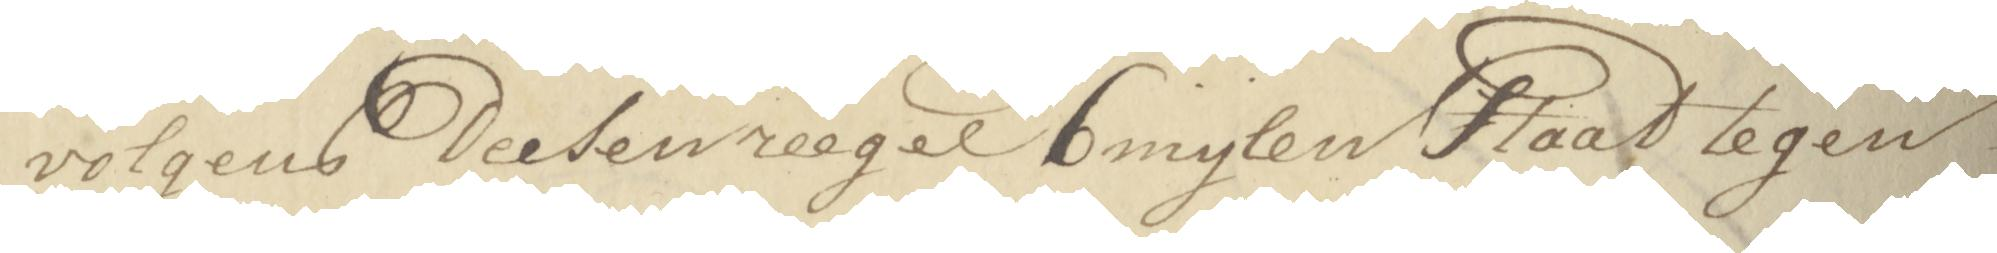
volgens deesen reegel 6 mijlen staad tegen
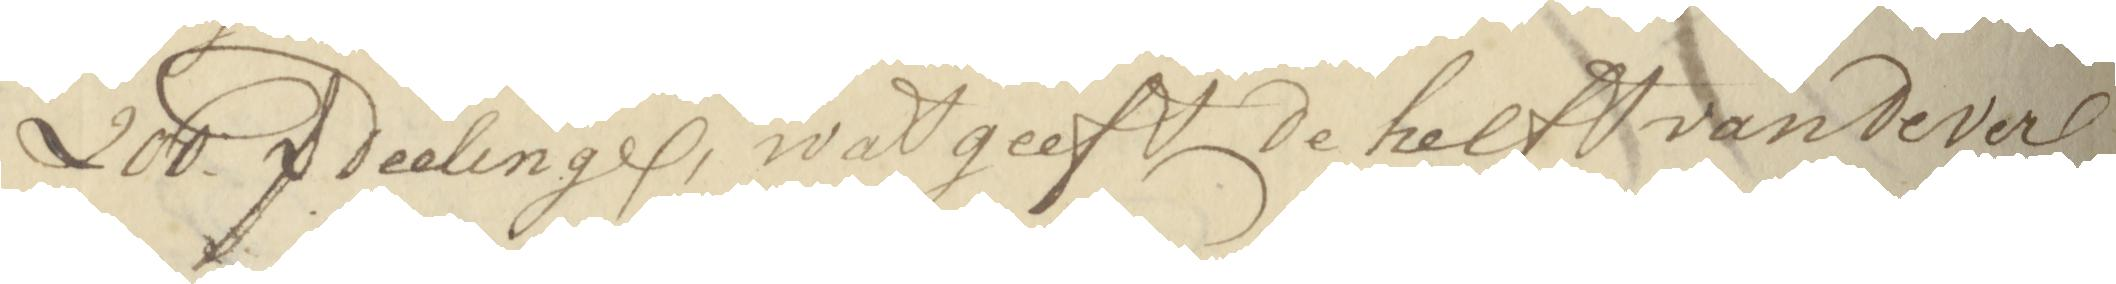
200: verdeelinge, wat geeft de helft van de ver„
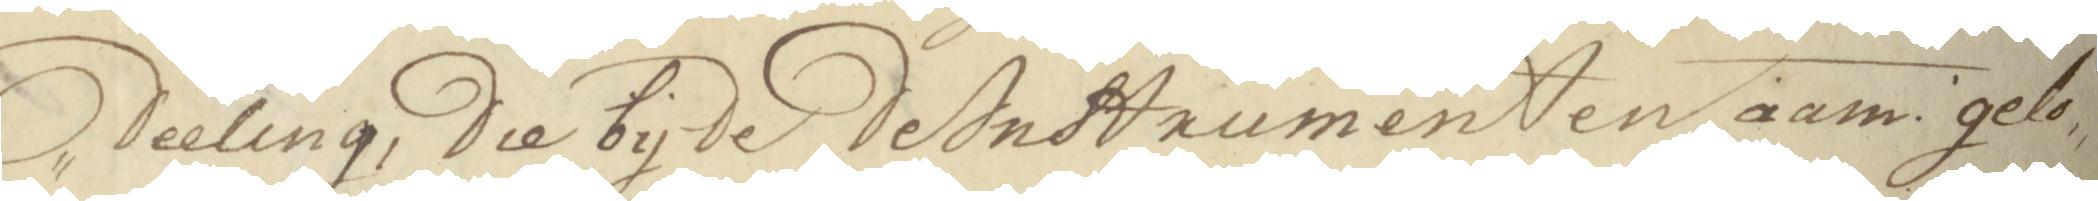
„deeling, die bij de de Instrumenten aam: gelo„
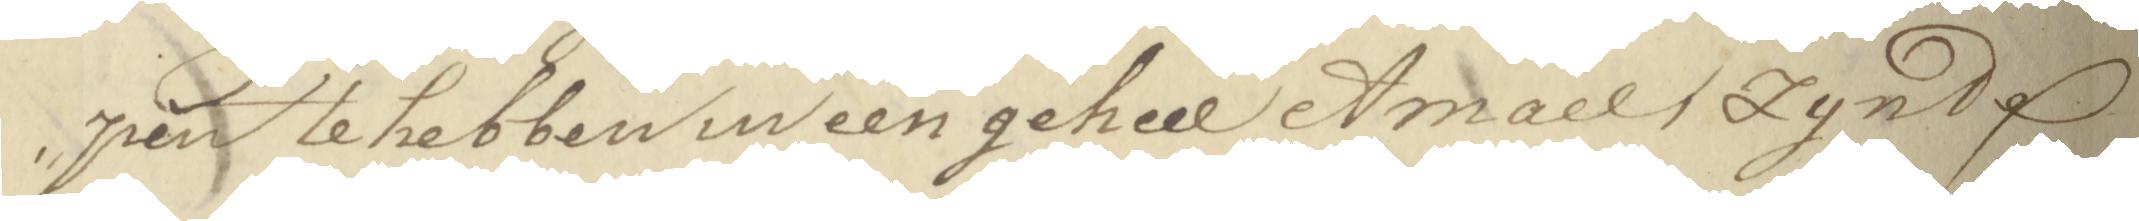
„pen te hebben in een geheel etmael, zijnde
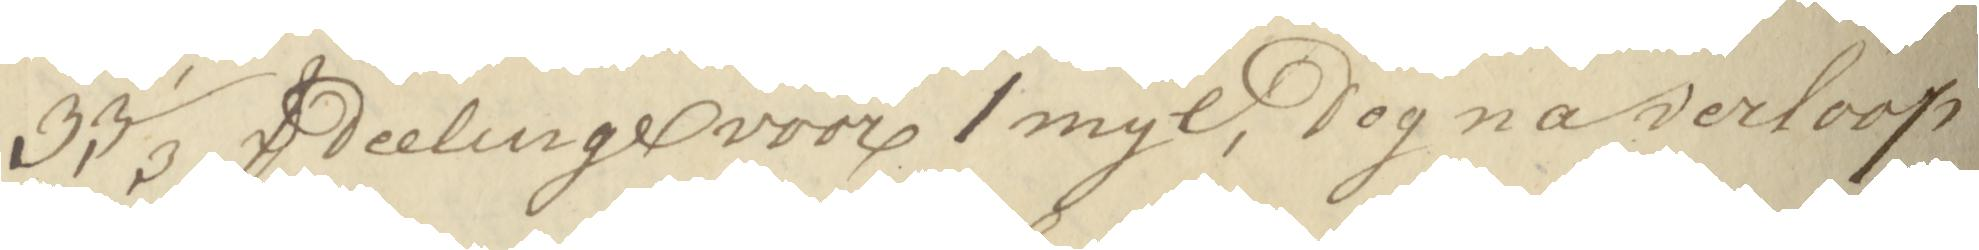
33 1/3 verdeelinge voor 1 mijl, dog na verloop
